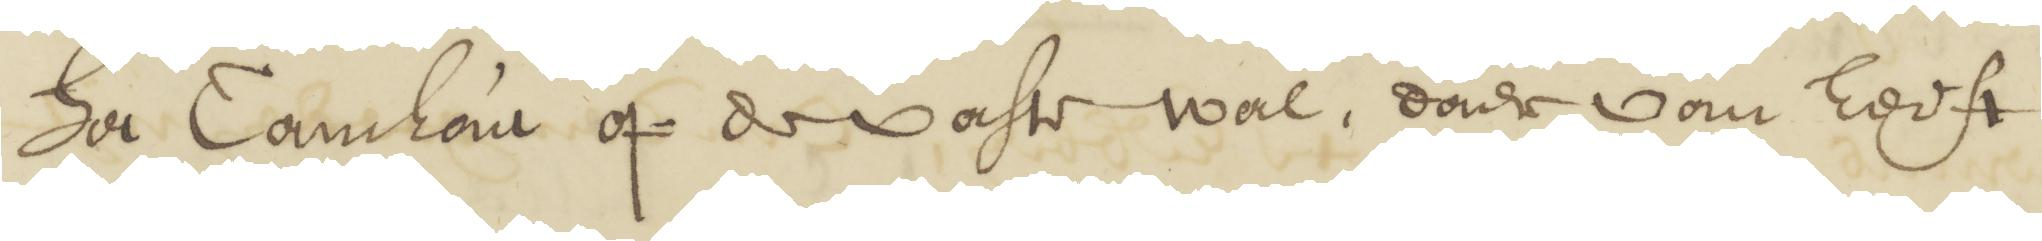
Het Camhout op de vaste wal, daer van heeft
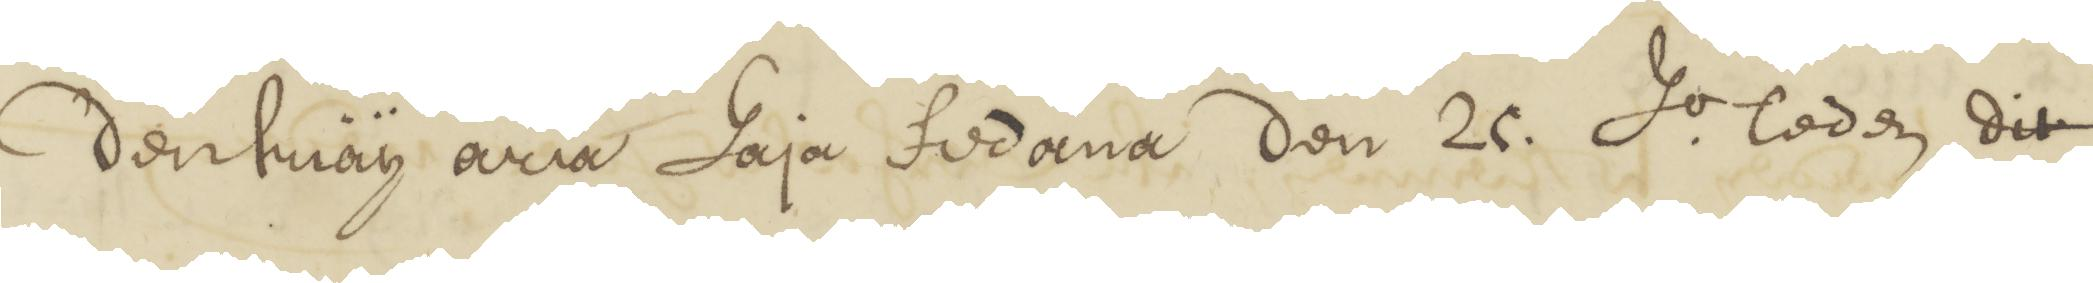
den kiaij aria Jaja sedana den 25. J.o leden dit
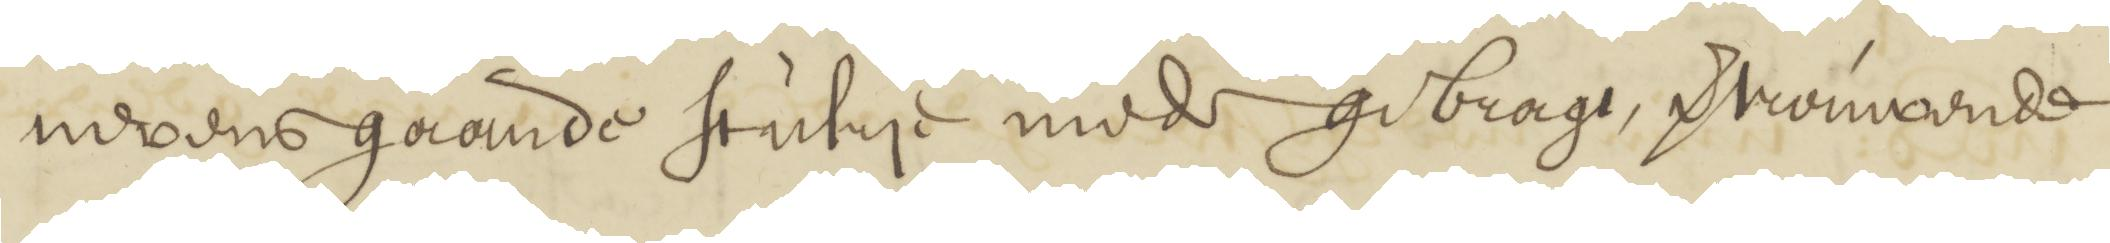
nevensgaande stukje medegebragt, vertrouwende
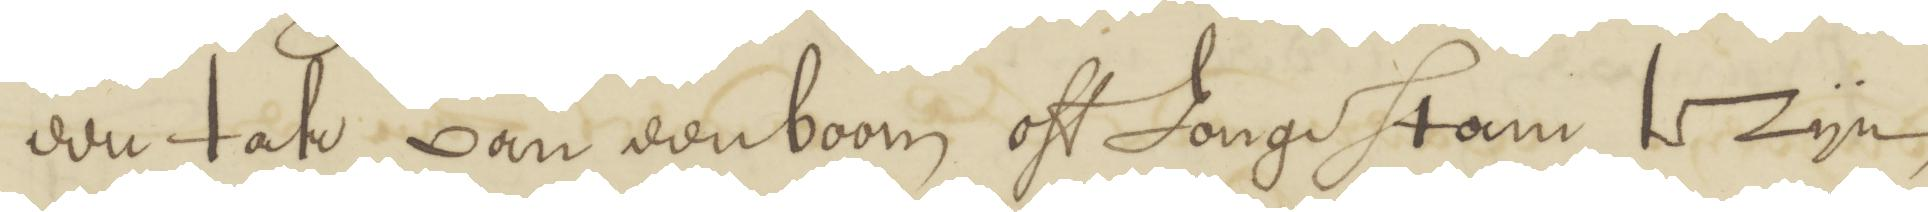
een tak van een boom oft Jongestam te zijn
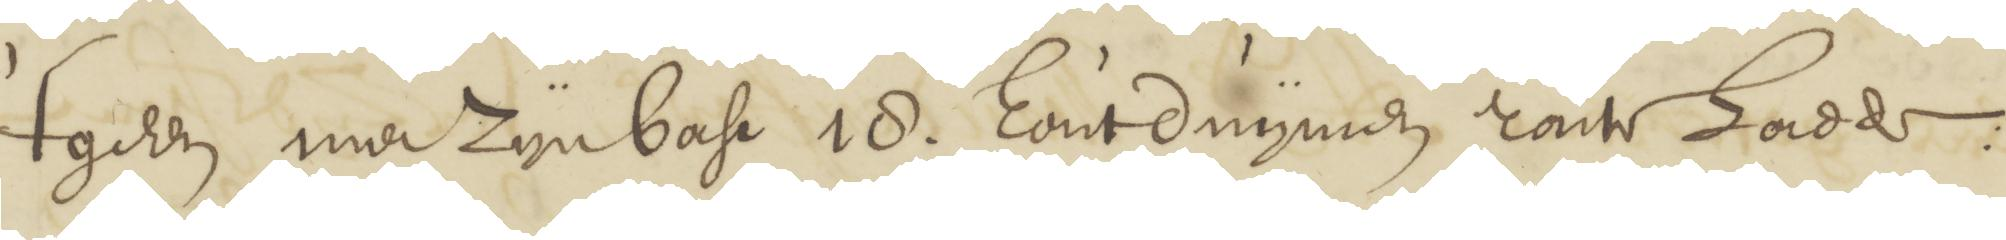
'tgeen met zijn bast 18. houtduijmen ronte hadde:
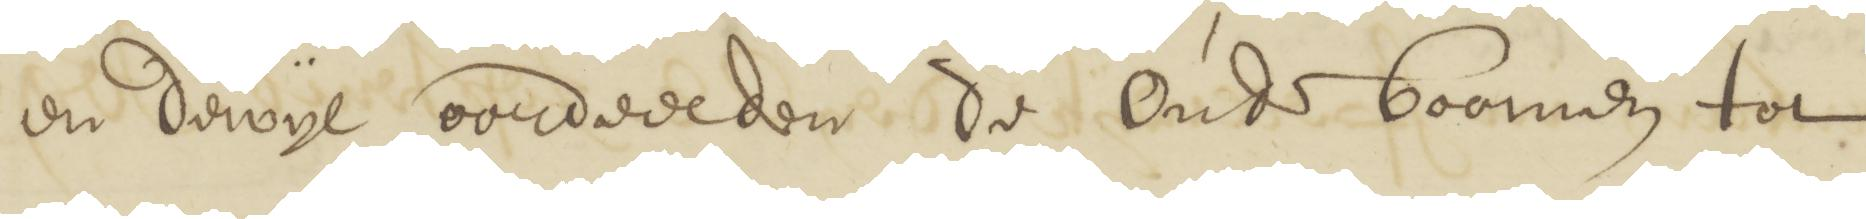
en dewijl oordeelden de Oude boomen tot
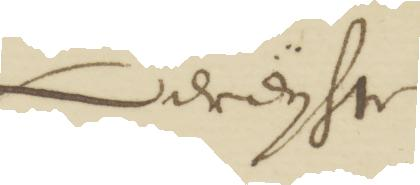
Vereijste
